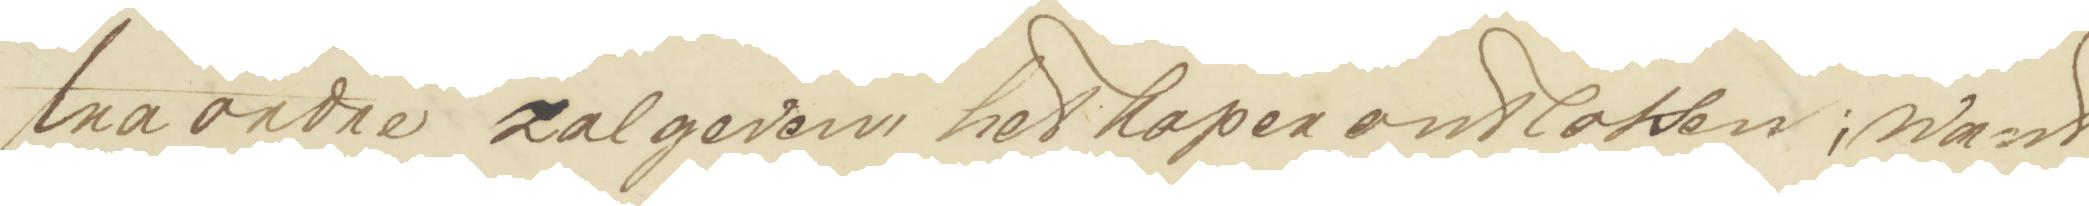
tra ordre zal geven, het koper ontlossen; want
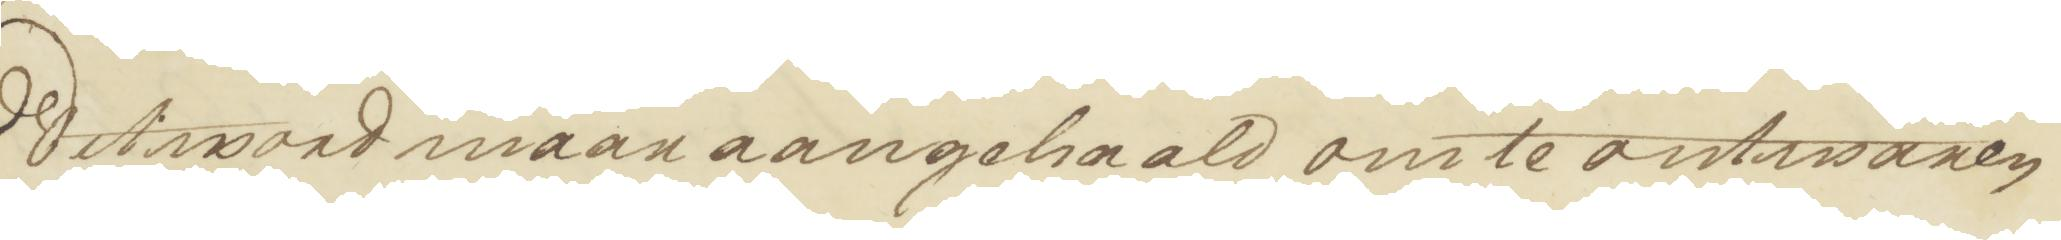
dit word maar aangehaald om te ontwaren
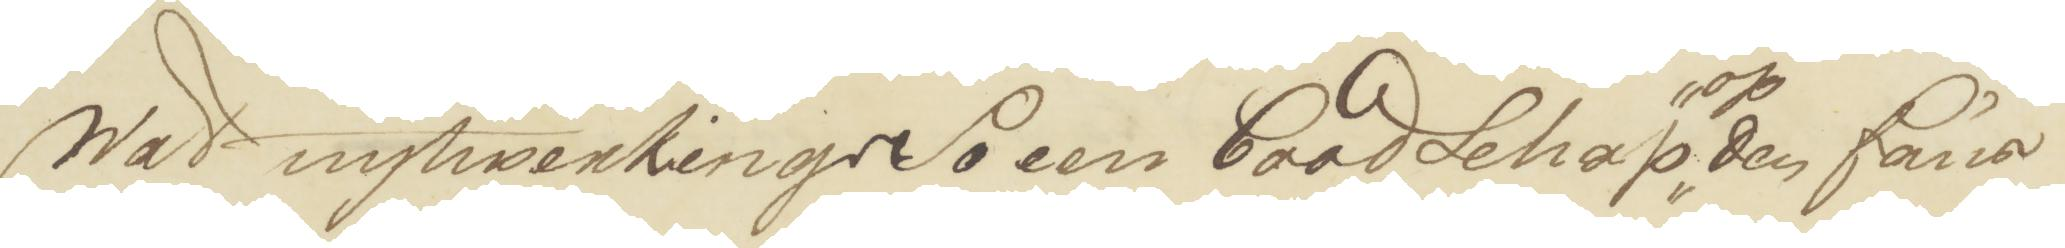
wat uijtwerkinge so een boodschap op den faus
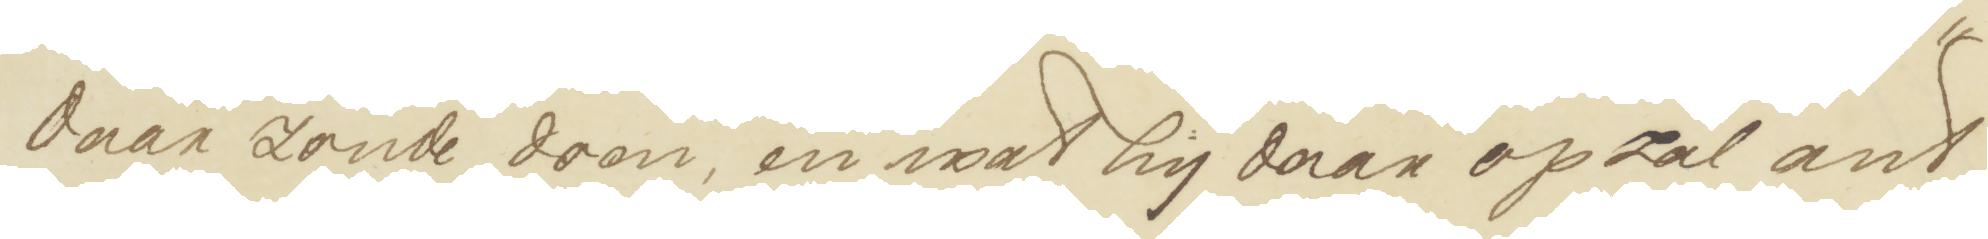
daar zoude doen, en wat hij daar op zal ant
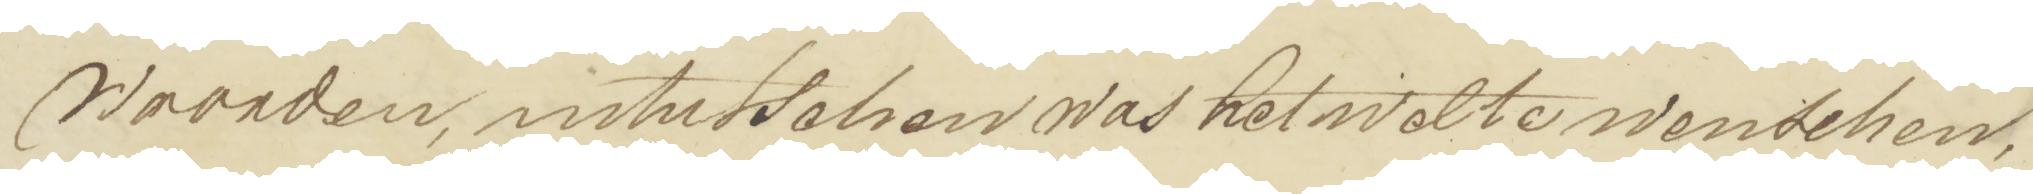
woorden, intusschen was het wel te wenschen,
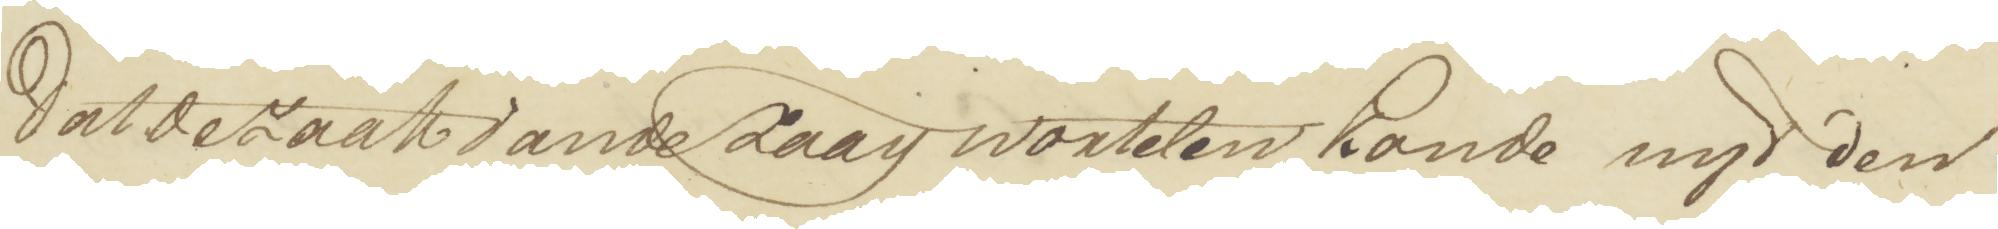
dat de zaak vande zaaij wortelen konde uijt den
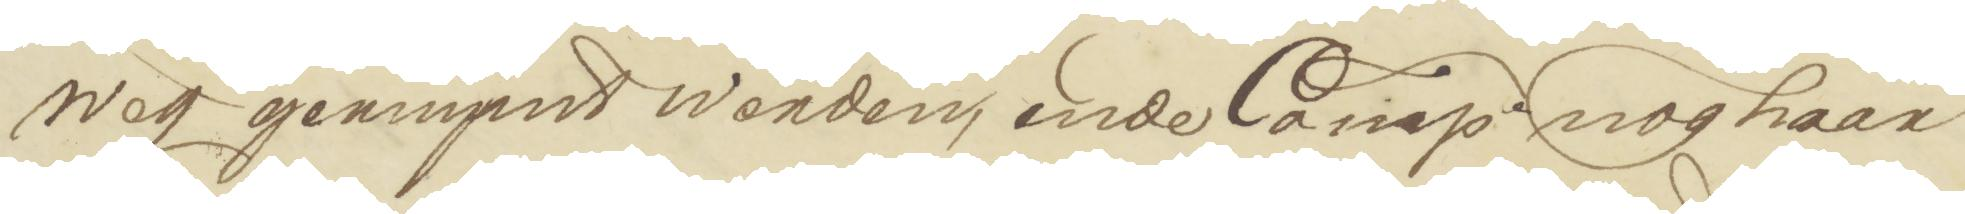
weg geruymt werden, ende Comps nog haar
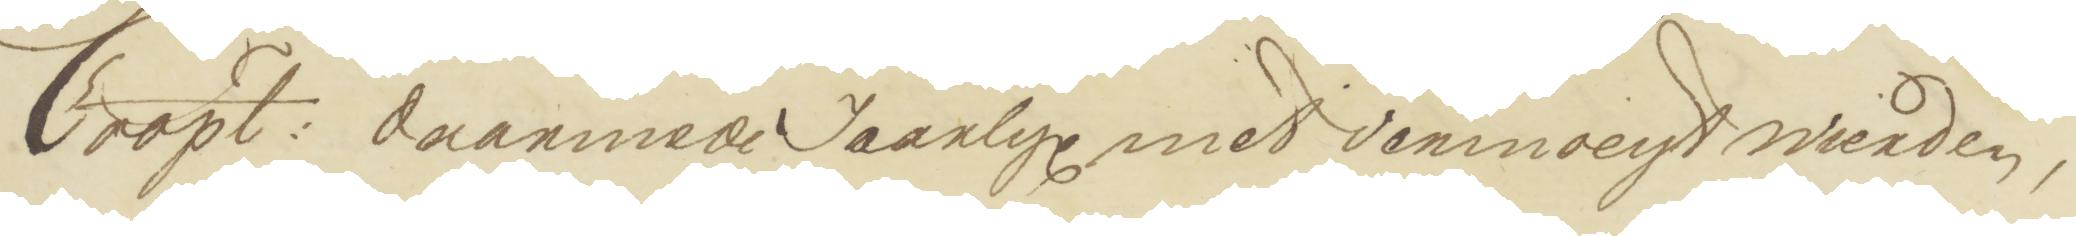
Coopl: daarmede Iaarlyx niet vermoeyt wierden,
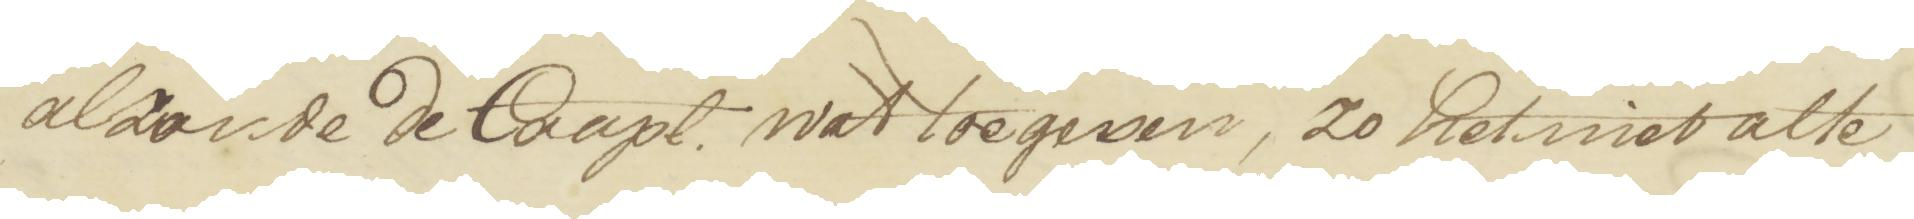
alzoude de Coopl. wat toegeven, zo het niet alte
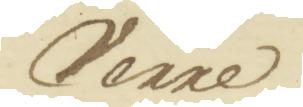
verre
